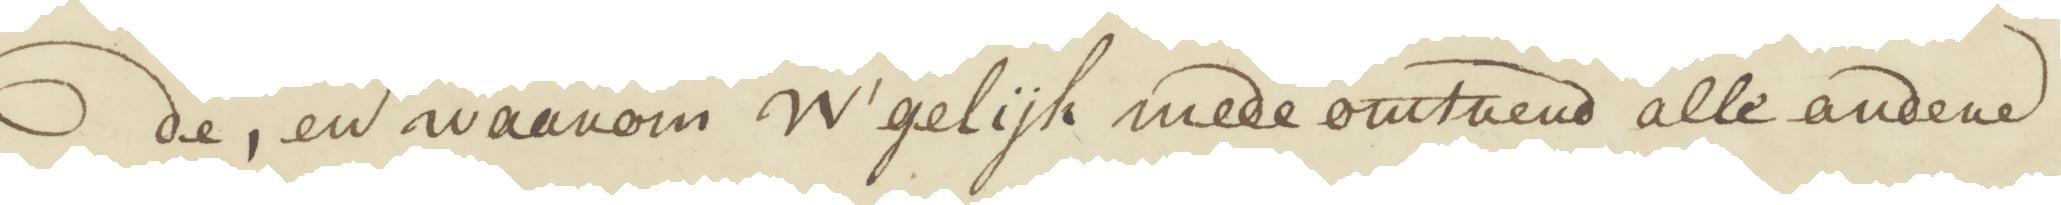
de, en waarom w' gelijk mede omtrend alle andere
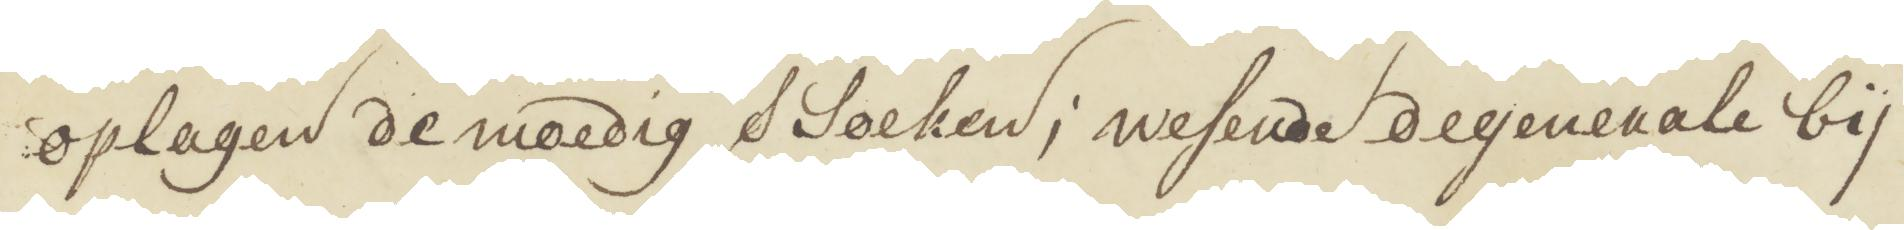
oplagen de moedig versoeken; wesende degenerale bij
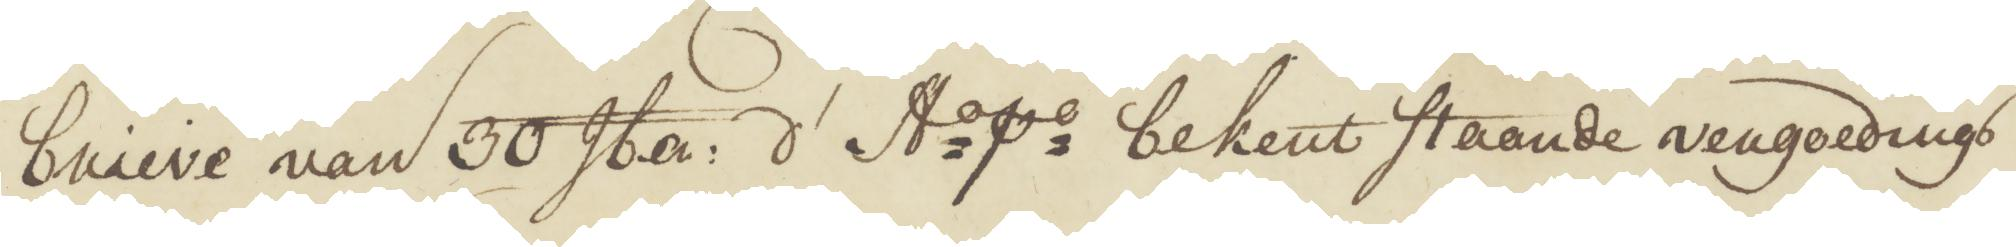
brieve van 30 9ber: d’ A=o p=o bekent staande vergoedings
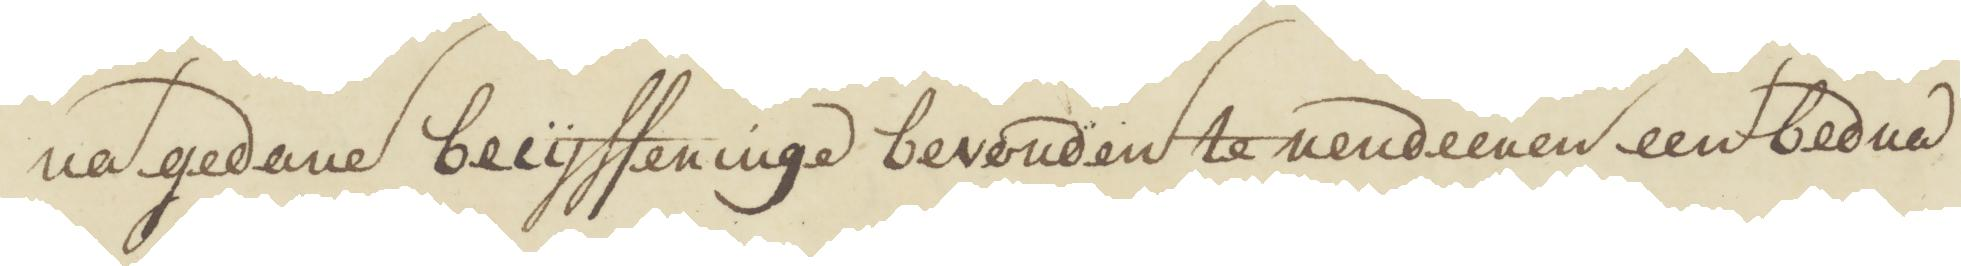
na gedane becijfferinge bevonden te rendeeren een bedra
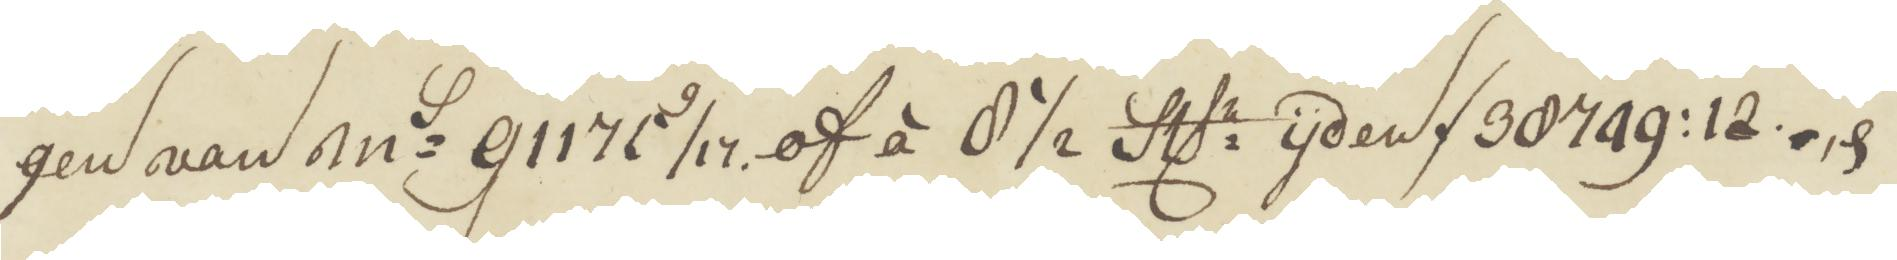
gen van m=s 91175 9/17. of à 8½ stver=r ijder ƒ 38749:12. -, en
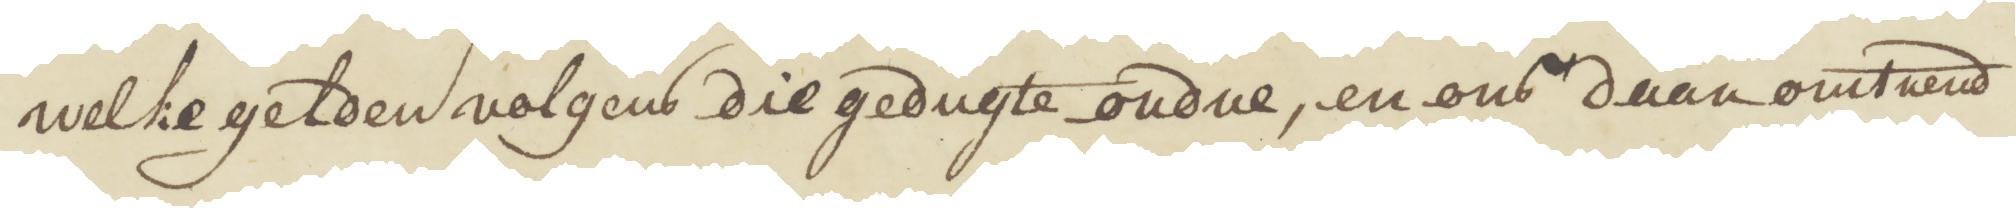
welke gelden volgens die gedugte ordre, en ons daar omtrend
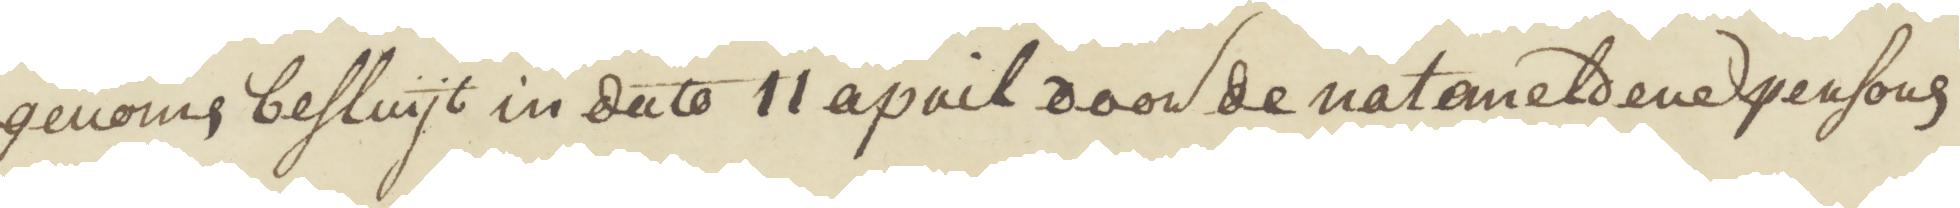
genomen besluijt in dato 11 april door de natemeldene personen
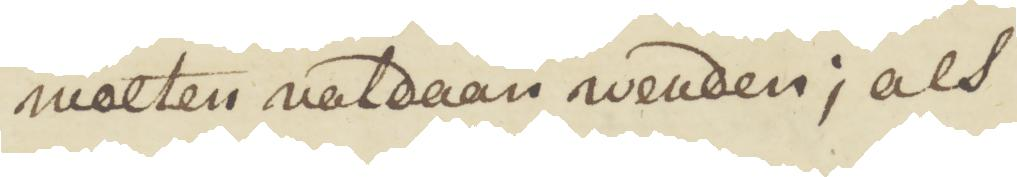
moeten voldaan werden; als
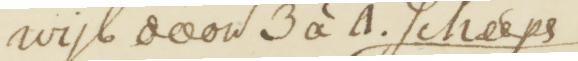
wijl door 3 à 4. scheepen
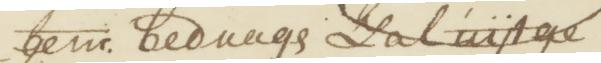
gem: bedragen zal uijtge
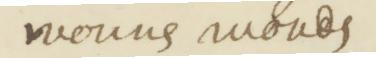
wonnen worden
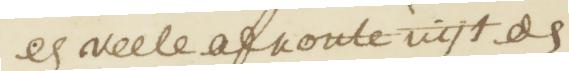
een veele afronte uijt den
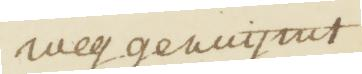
weg geruijmt
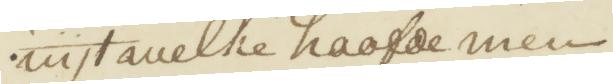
uijt welke hoofde men
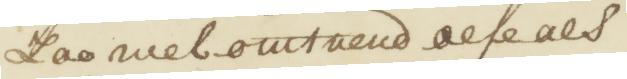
zoo wel omtrend dese als
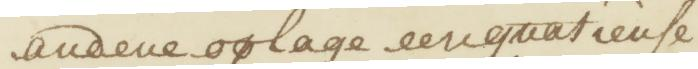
andere oplage een gratieuse
